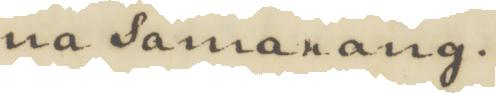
na Samarang.
